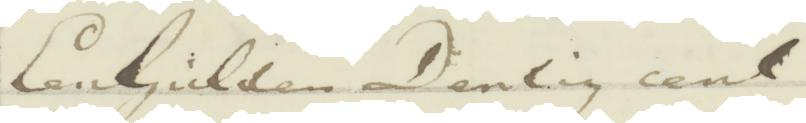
EenGulden Dertig cent
